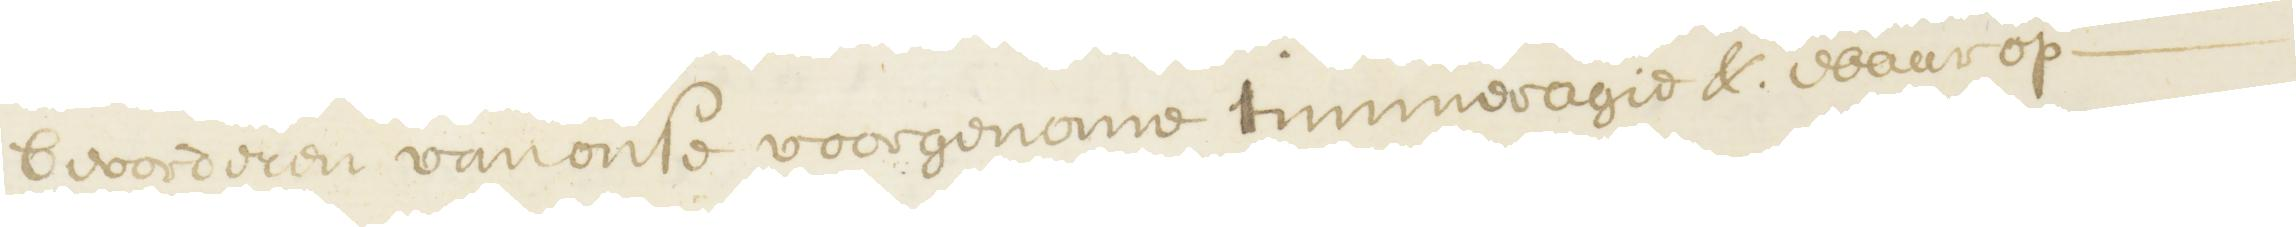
bevorderen van onse voorgenome timmeragie &. waar op —
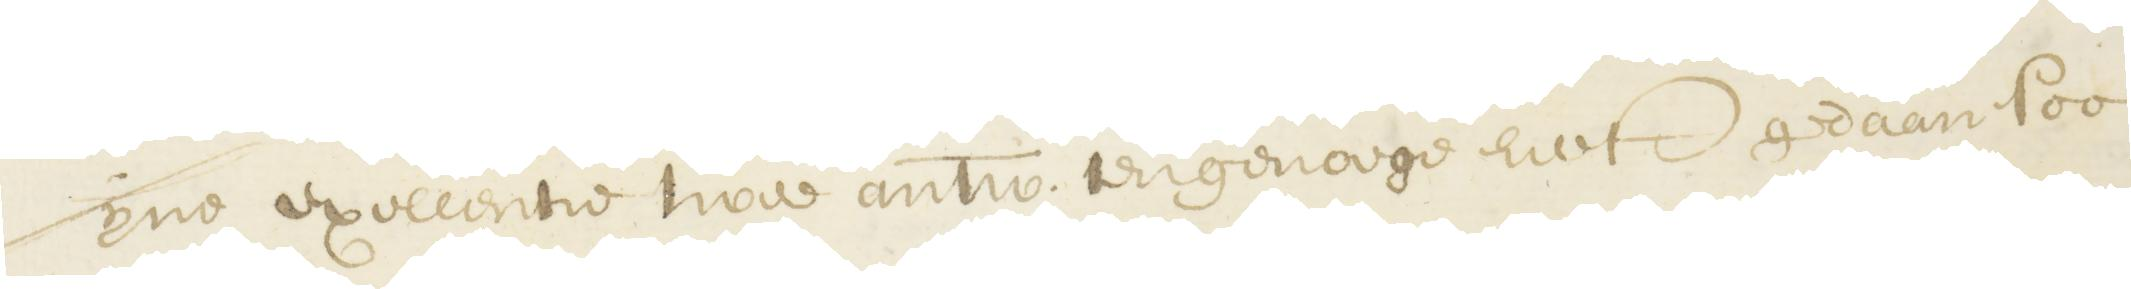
sijne exellentie twee antw. ten genoege heeft gedaan soo
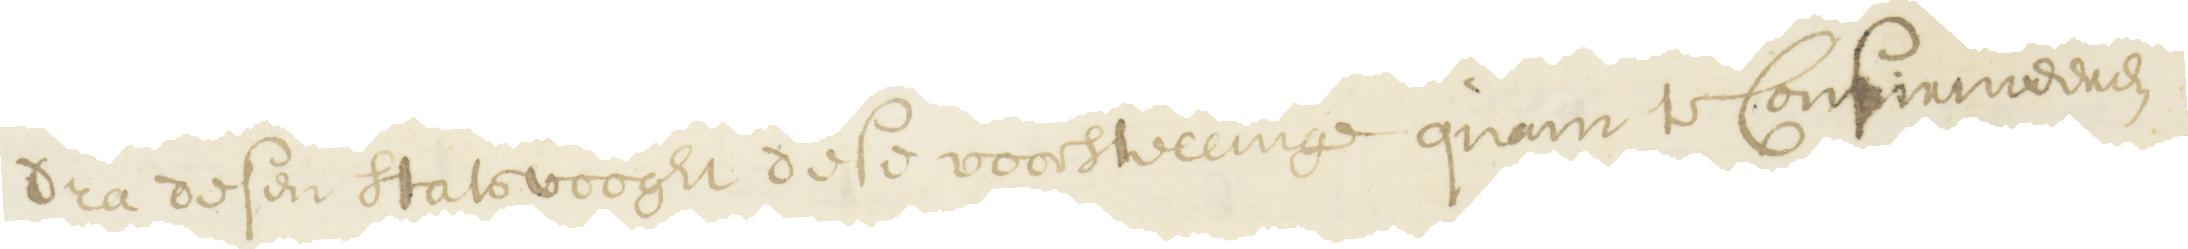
dra desen statsvooght dese voorstellinge quam te Confirmeeren
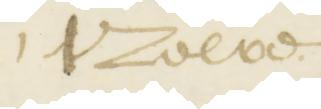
'tzelve.
